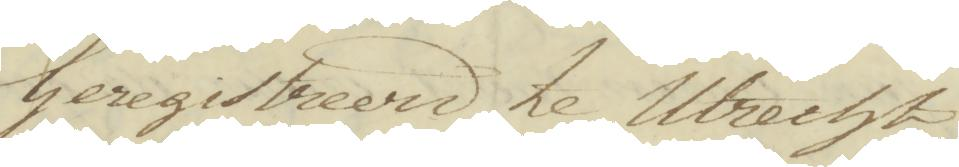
Geregistreerd te Utrecht
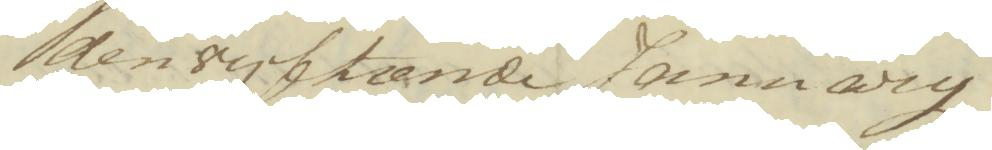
den vyftiende Januarij
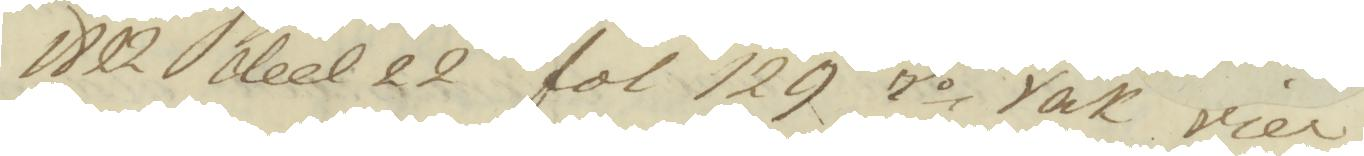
1822 deel 22 fol 129 r=o vak vier
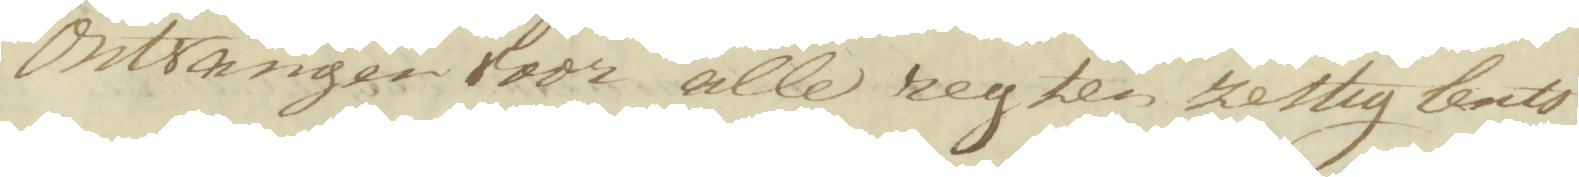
Ontvangen voor alle regten zestig Cents
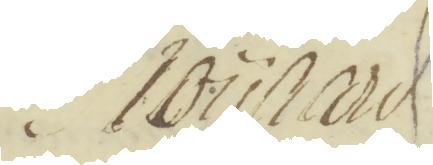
Moijaard
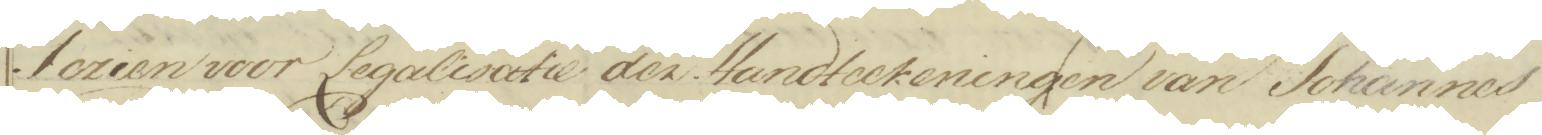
Gezien voor Legalisatie der Handteekeningen van Johannes
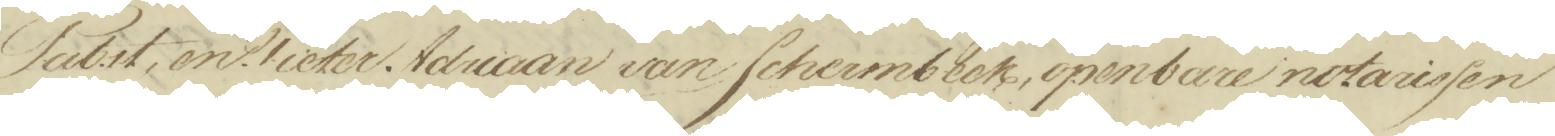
Pabst, en Pieter Adriaan van Schermbeek, openbare notarissen
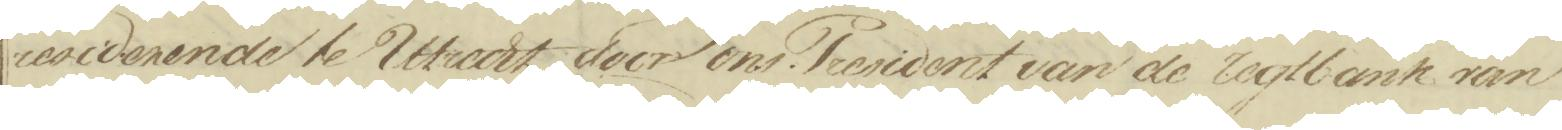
residerende te Utrecht; door ons President van de Regtbank van
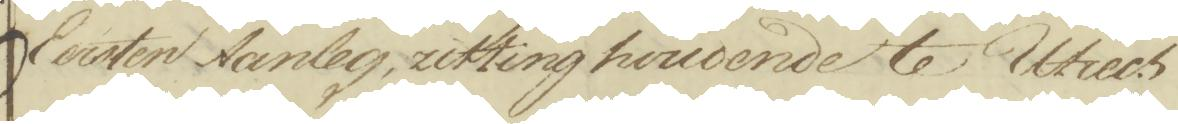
Eersten Aanleg, zitting houdende te Utrech
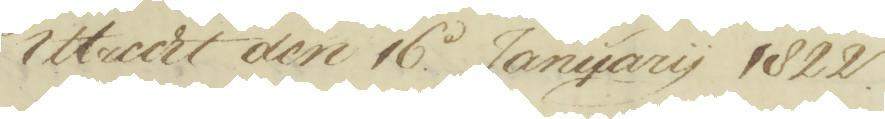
Utrecht den 16.e Januarij 1822
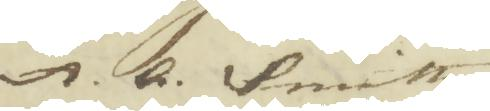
A. h. Smittz
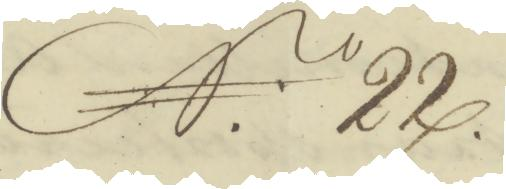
N: 22.
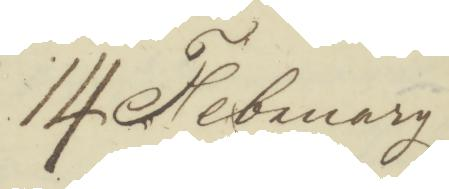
14 February
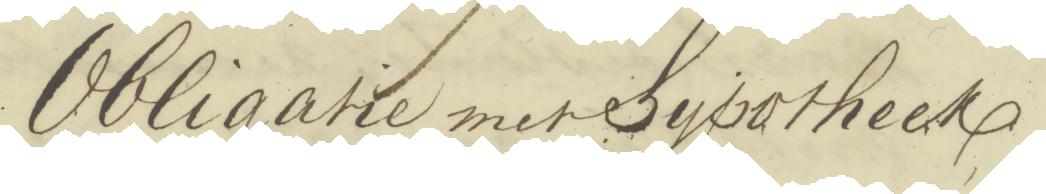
Obligatie met hypotheek
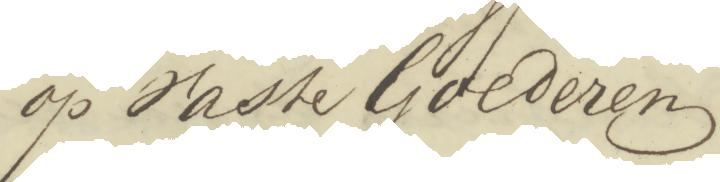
op vaste Goederen
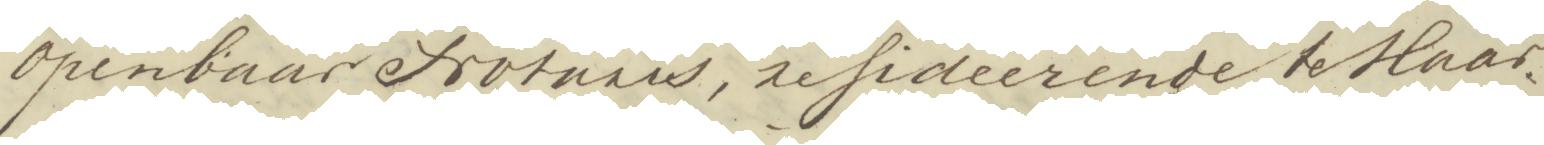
openbaar Notaris, resideerende te Haar„
